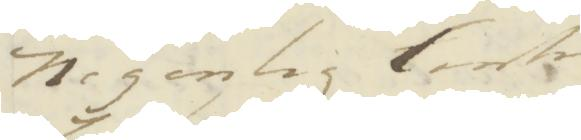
negentig Cent
